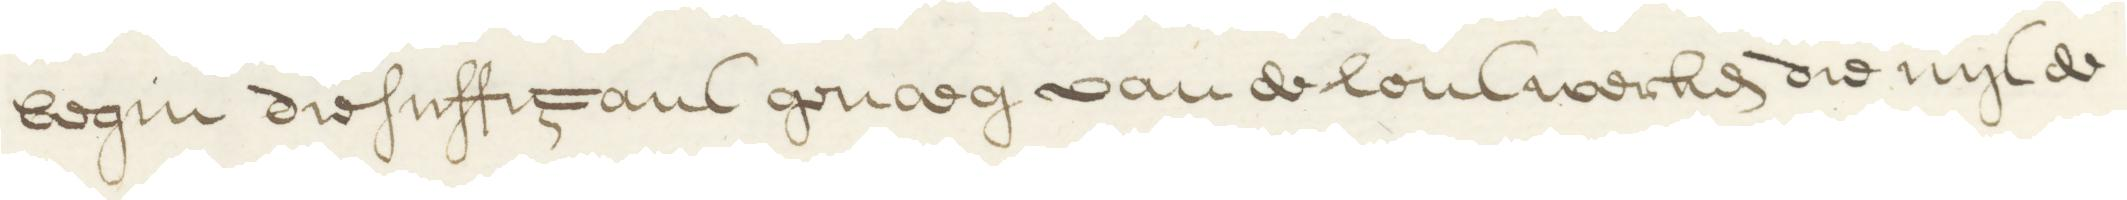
begin die suffiçant genoeg van de houtwerken die uyt de
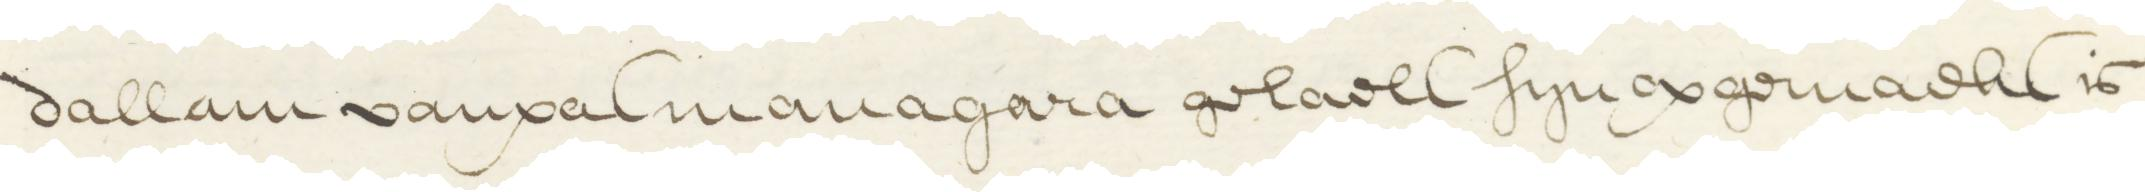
dallam van patmanagara gehaelt syn opgemaekt is
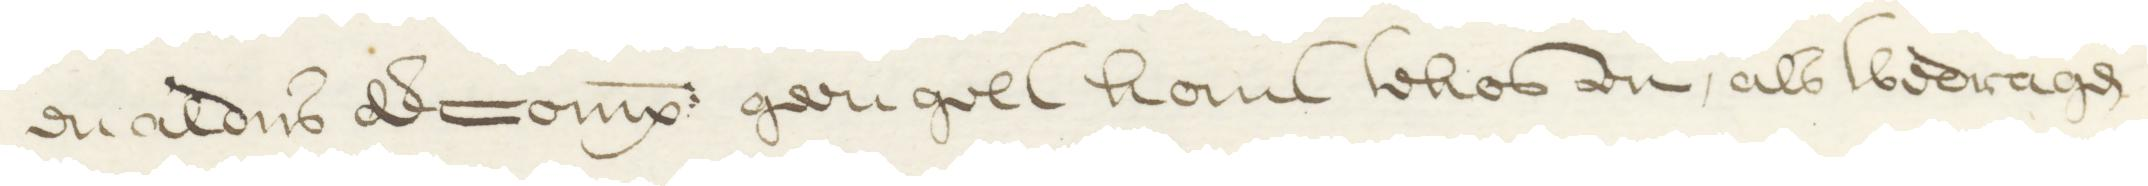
en aldus de comp: geen gelt komt te kosten, als t bedragen
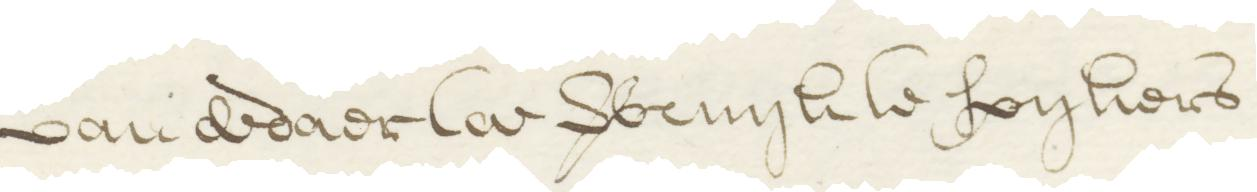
van de daer toe verbruyk te spykers
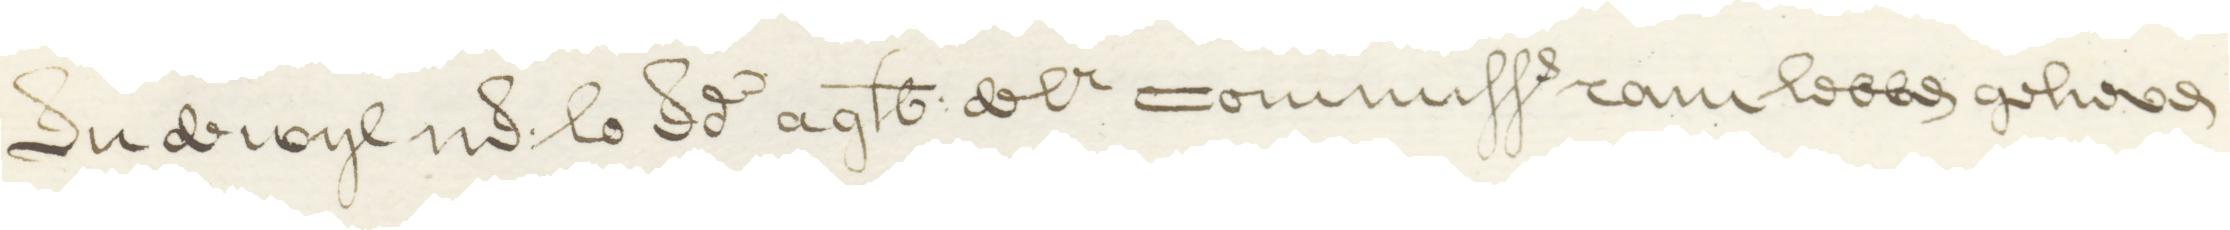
En dewyl uE: ho Ede agtb: de hr commisss ram hebben gelieven
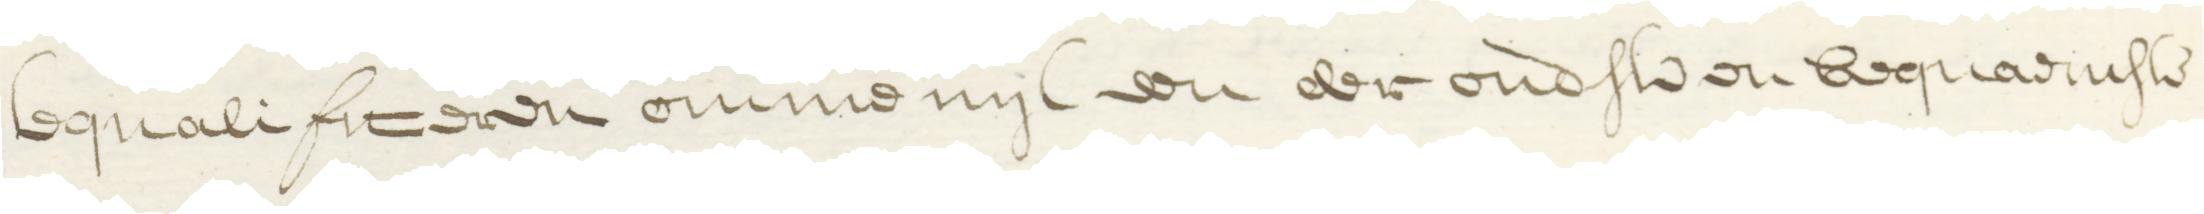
te qualificeren omme uyt een der oudste en bequaemste
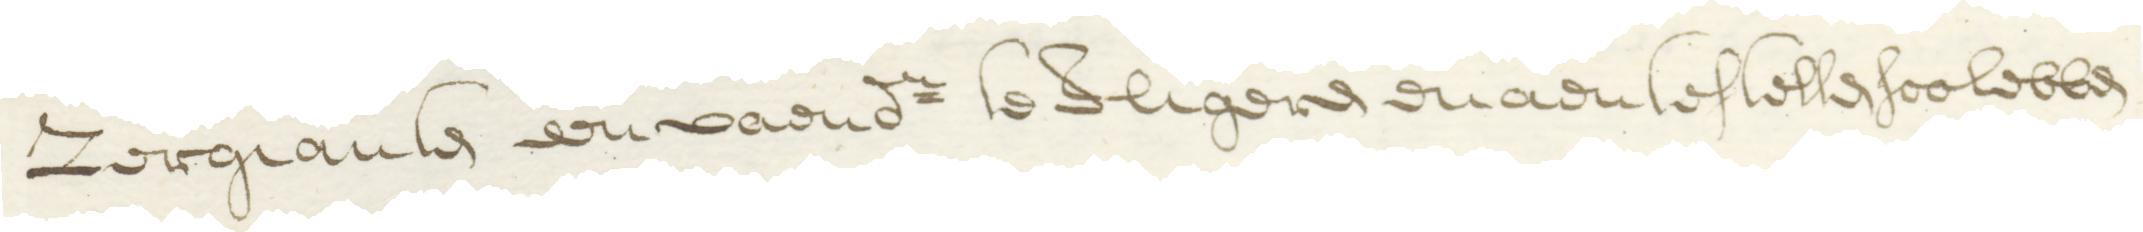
zergianten een vaend=r te Eligeren en aen te stellen soo hebben
